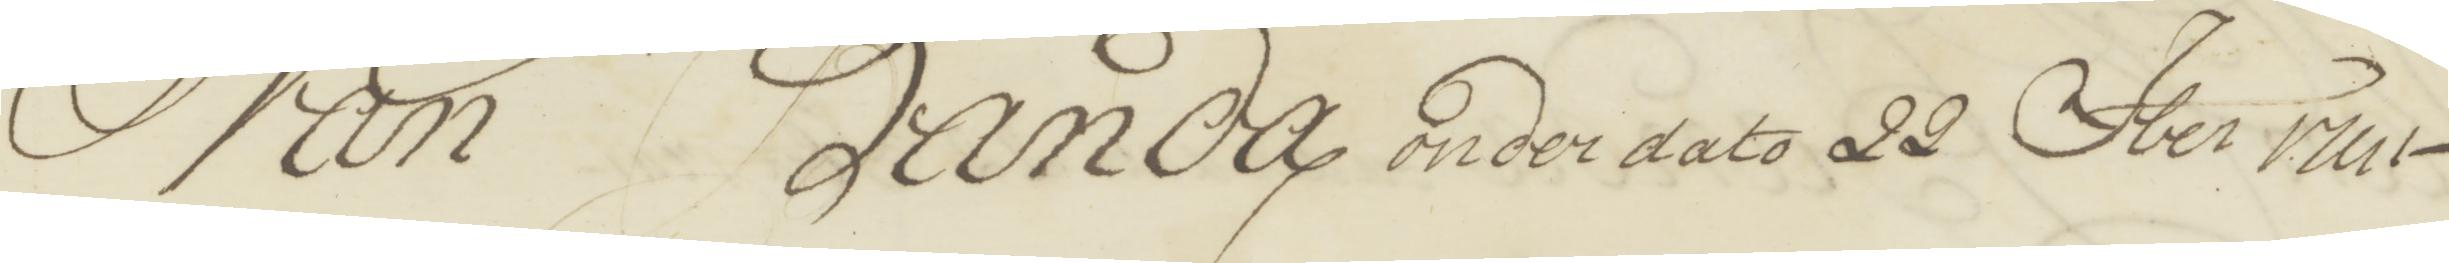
Van Banda onder dato 28 7ber 1741-
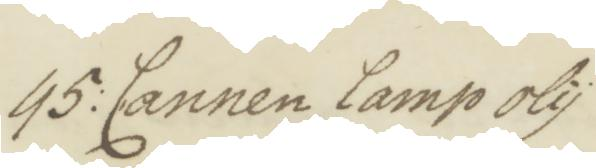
45: cannen lamp olij
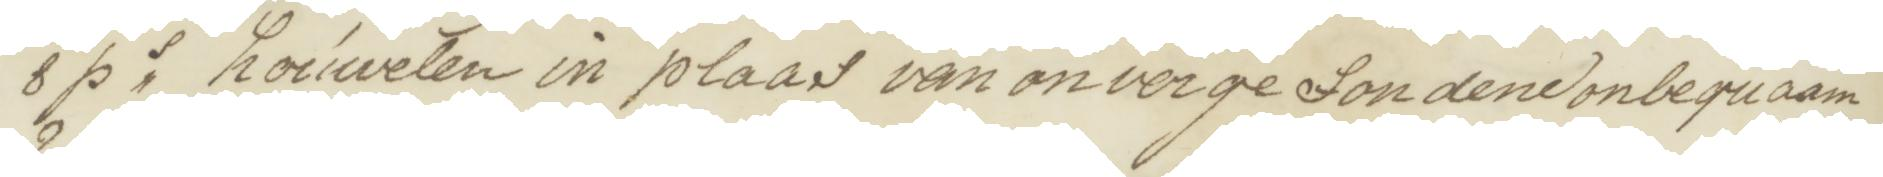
8 p„s houwelen in plaas van onvergesondene onbequaam
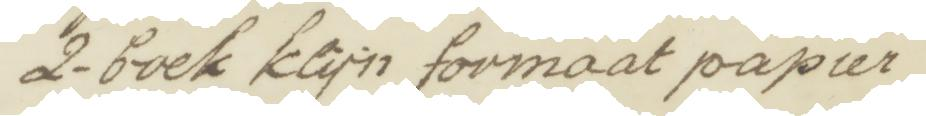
2- boek klijn formaat papier
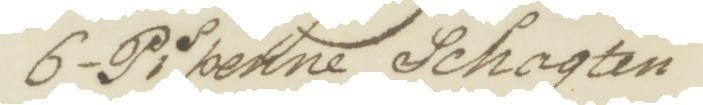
6- P„s penne schagten
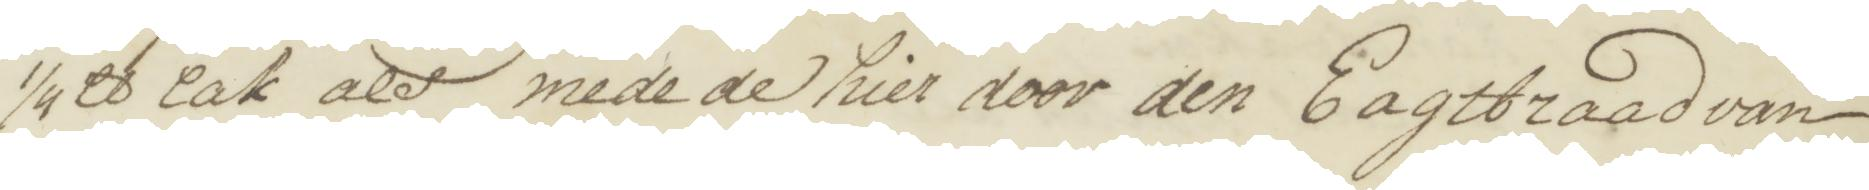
¼ lb lak als mede de hier door den E agtbraad van
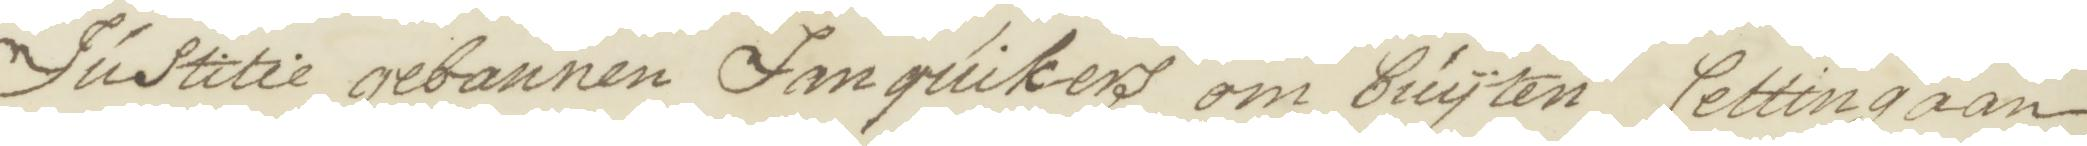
Justitie gebannen Ian quikers om buijten cetting aan
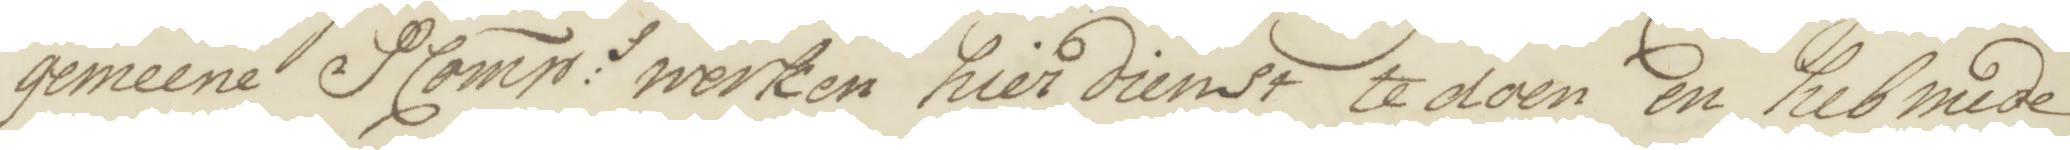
gemeene sComp:s werken hier dienst te doen en heb mede
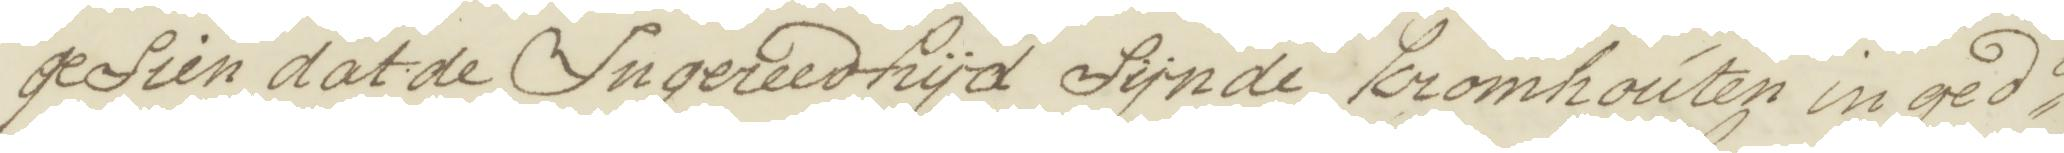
gesien dat de Jngereedhijd sijnde kromhouten in ged„
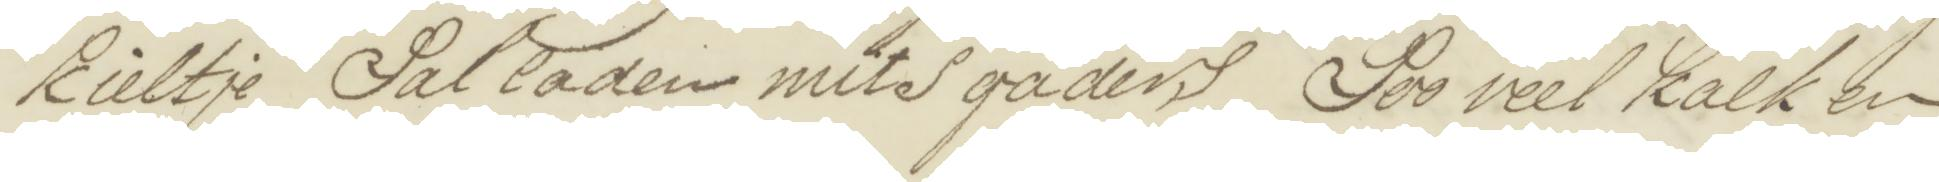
kieltje sal laden mitsgaders soo veel kalk en
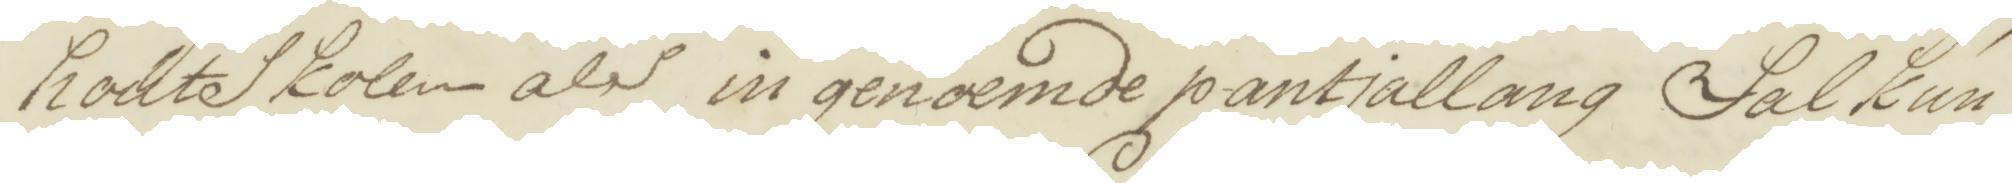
houts kolen als in genoemde pantjallang sal kun
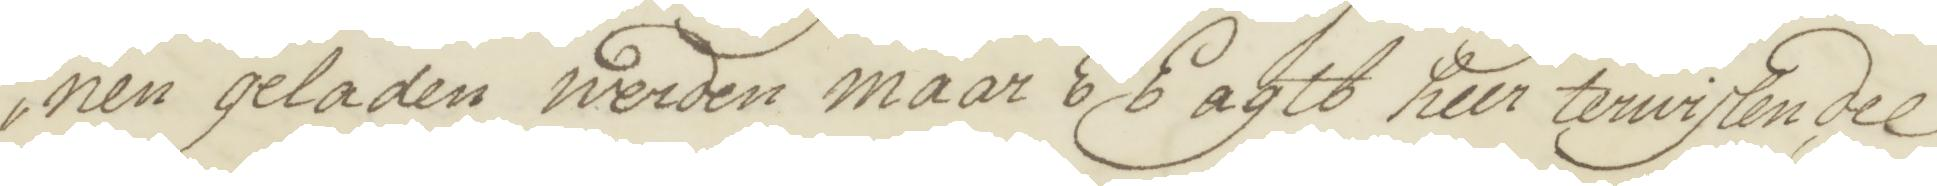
„nen geladen werden maar E E agtb heer terwijlen de
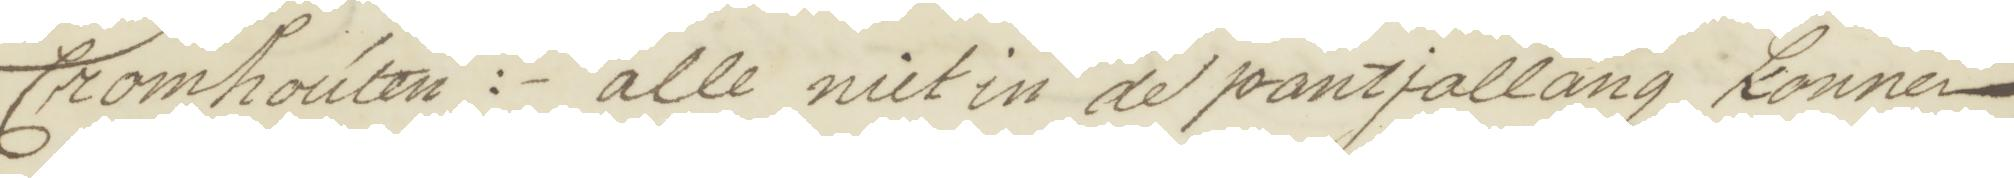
cromhouten :- alle niet in de pantjallang konnen
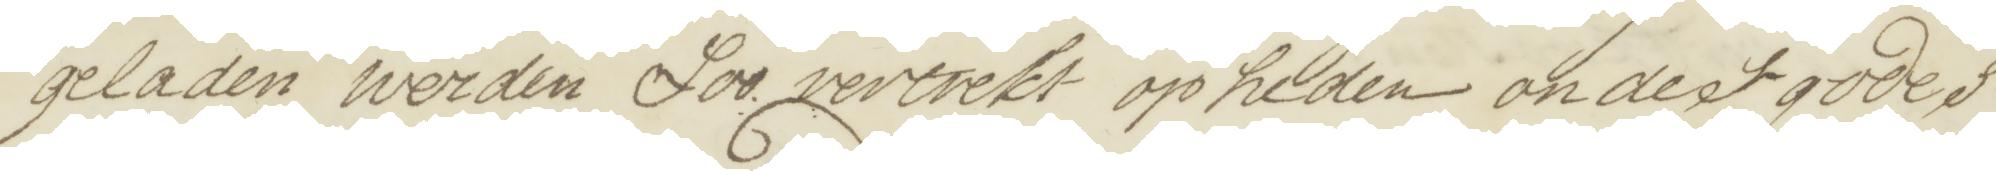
geladen werden soo vertrekt op heden onder godes
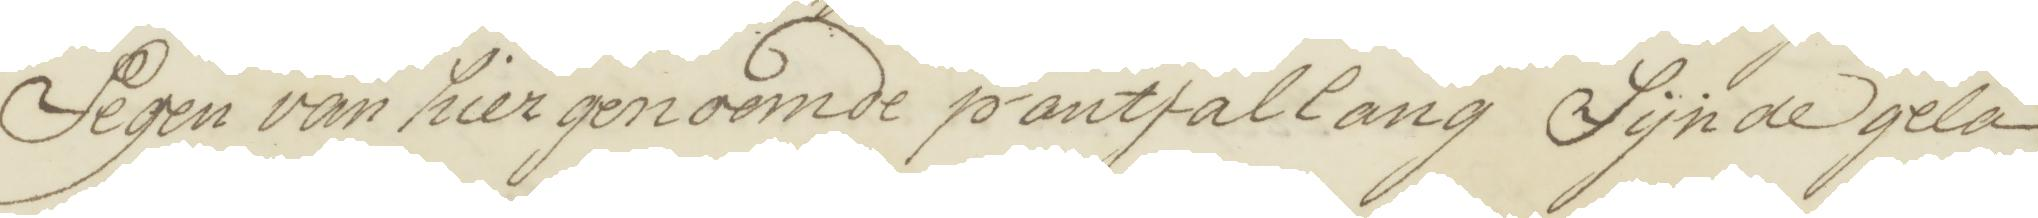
segen van hier genoemde pantjallang sijnde gela
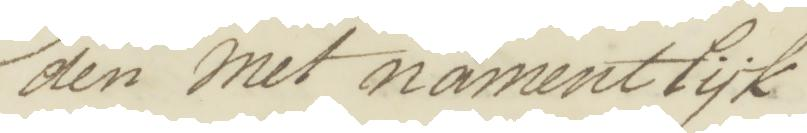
den met namentlijk
